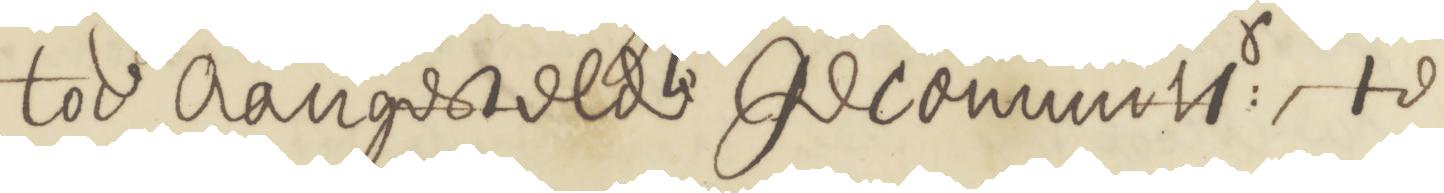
toe aangestelde Gecommitt:s, te
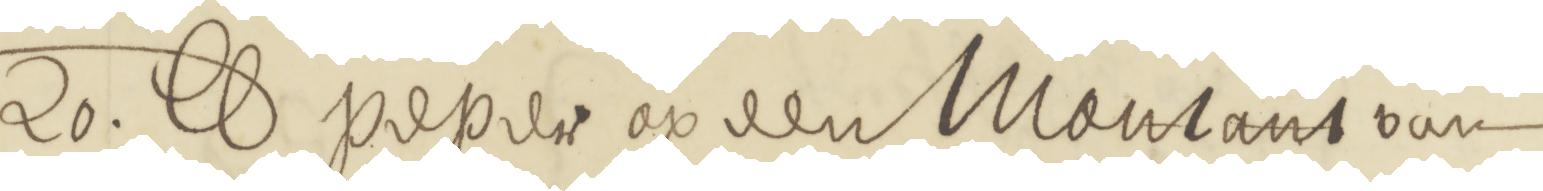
20. lb peper op een Montant van
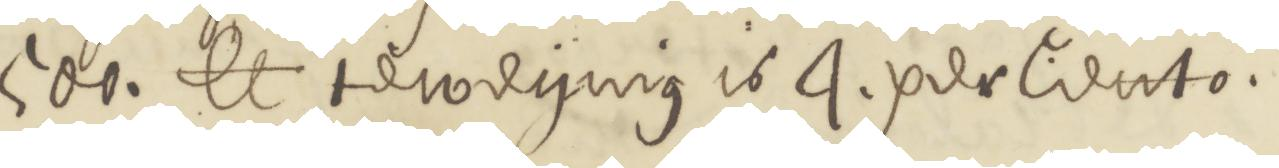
500. lb te weijwig is 4. per Cento.
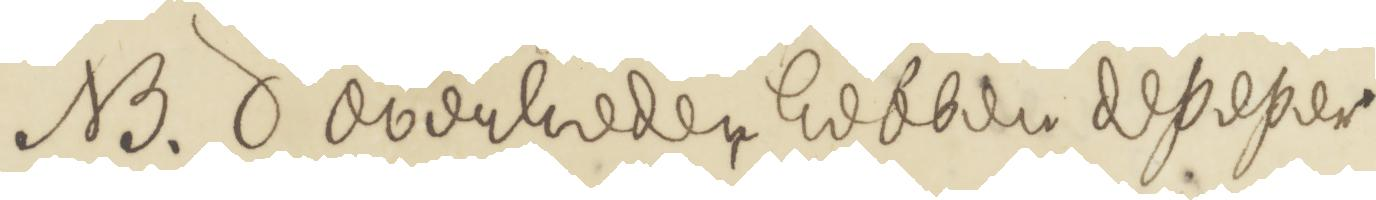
NB. D' overheden hebben de peper
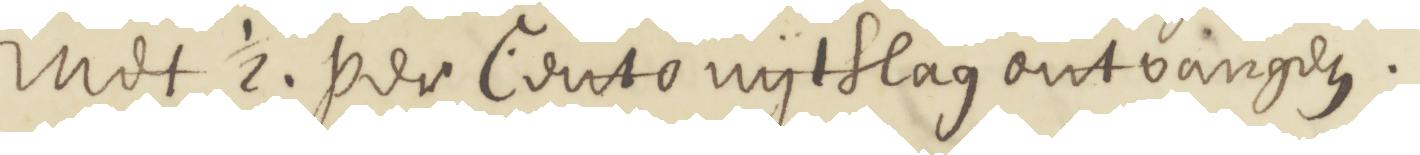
met ½. per Cento uijtslag ontvangen.
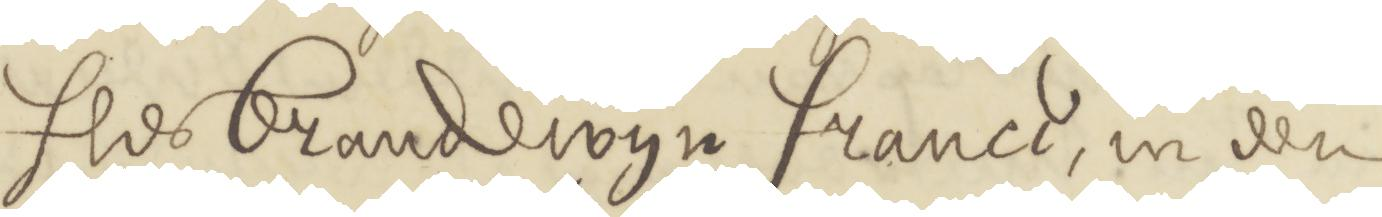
fles brandewijn france, in een
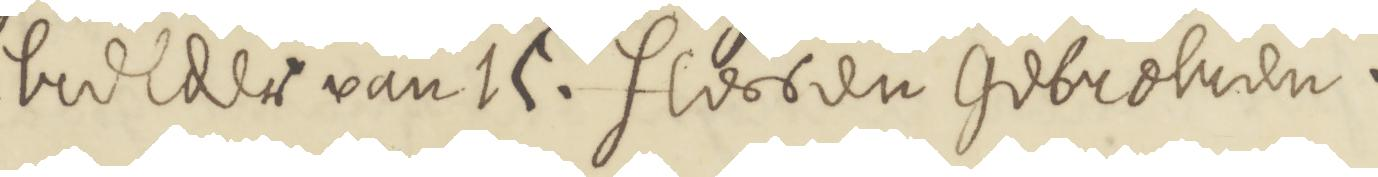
kelder van 15. flessen gebroken.
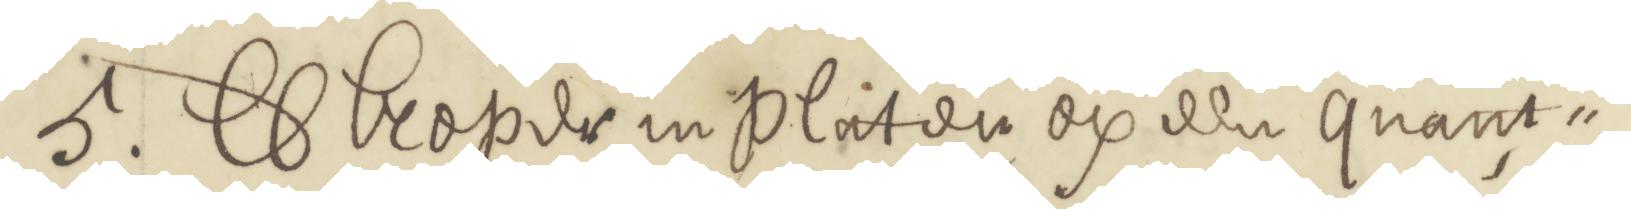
5: lb Koper in platen op een quant„t
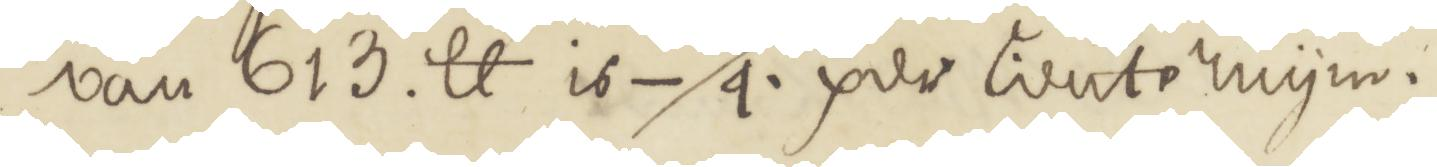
van 613. lb is — ¾. per Cento ruijm.
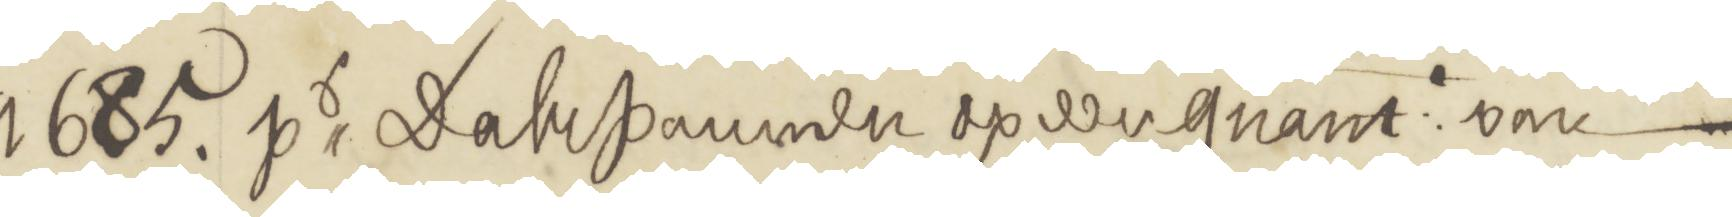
1685. p„s Dakpannen op een quant:t van
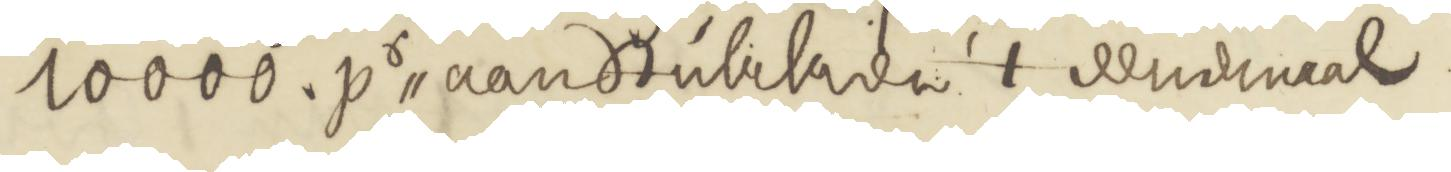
10000. p„s aan Stukken ’t eenemaal
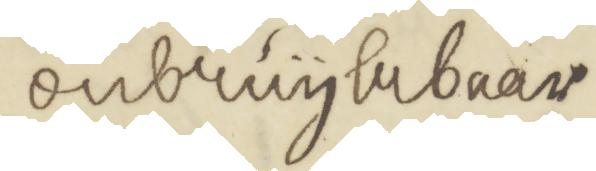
onbruijkbaar.
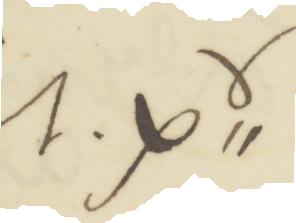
1. p„s
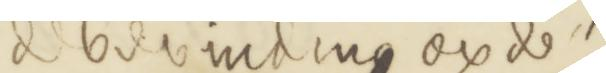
de bevinding op de„
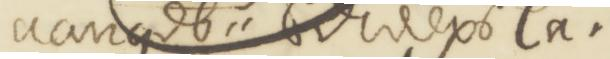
aangeb:e scheeps la„
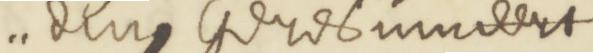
„ding geresumeert
